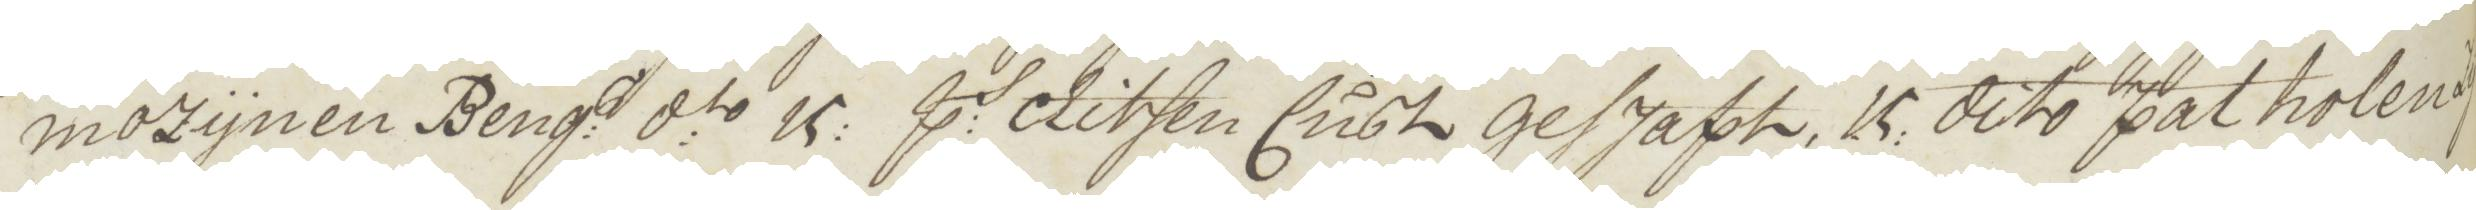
mozijnen Beng:s d:to 15: p:s chitsen Cust gesjapt, 15. dito patholen
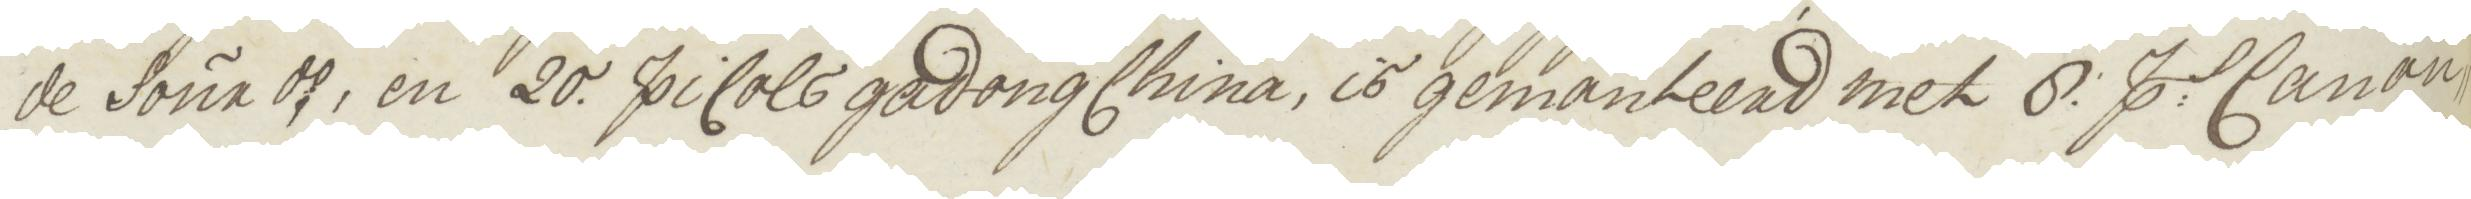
de Sour d:o, en 20. picols gadong China, is gemonteerd met 8: p:s Canon„
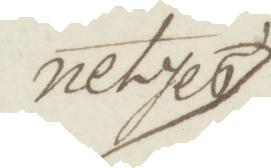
netjes
